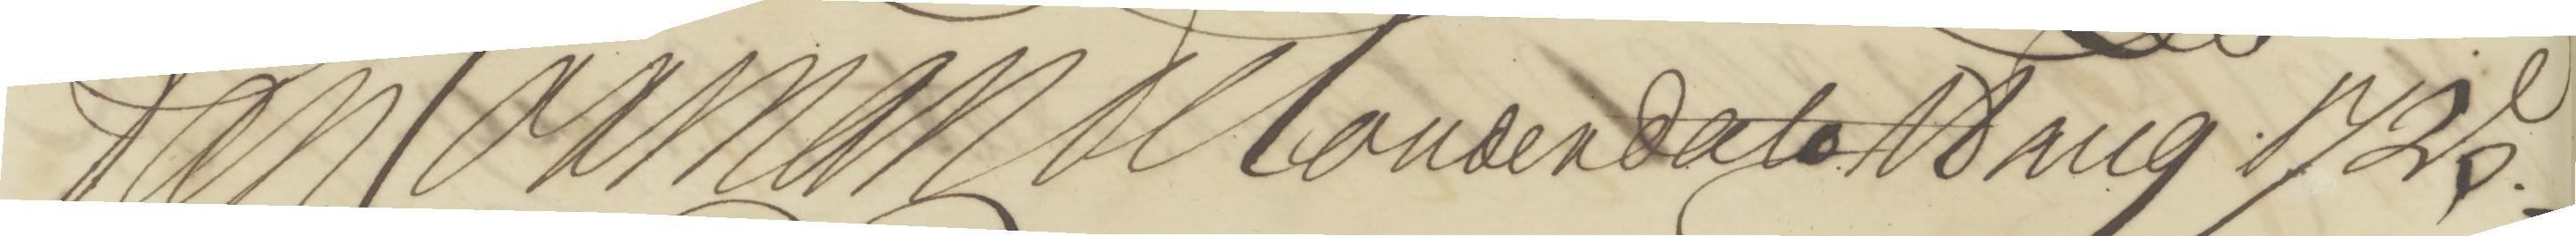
Van Cormandel onder dato 18 aug 1720.
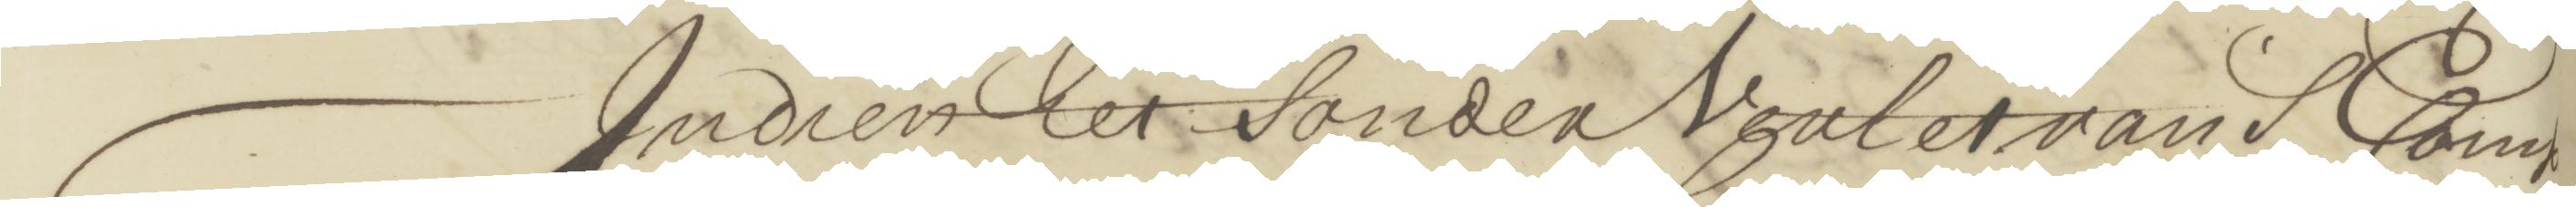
Jndien het sonder verlet van 's Com
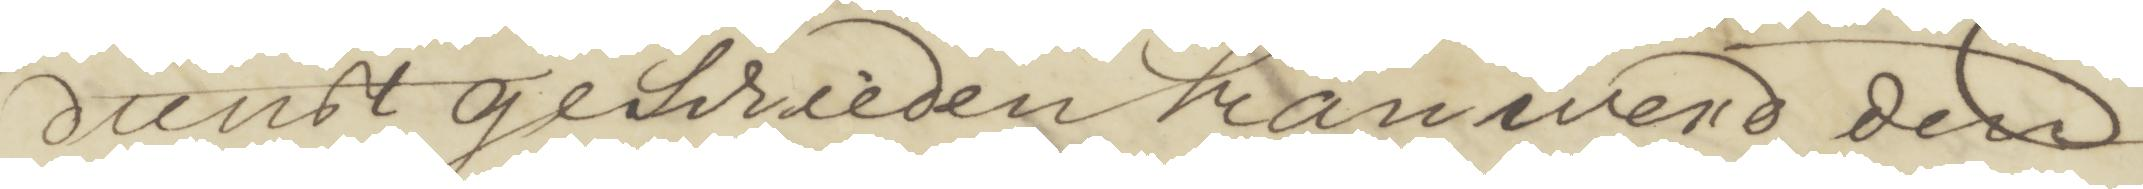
dienst geschieden kan werd den
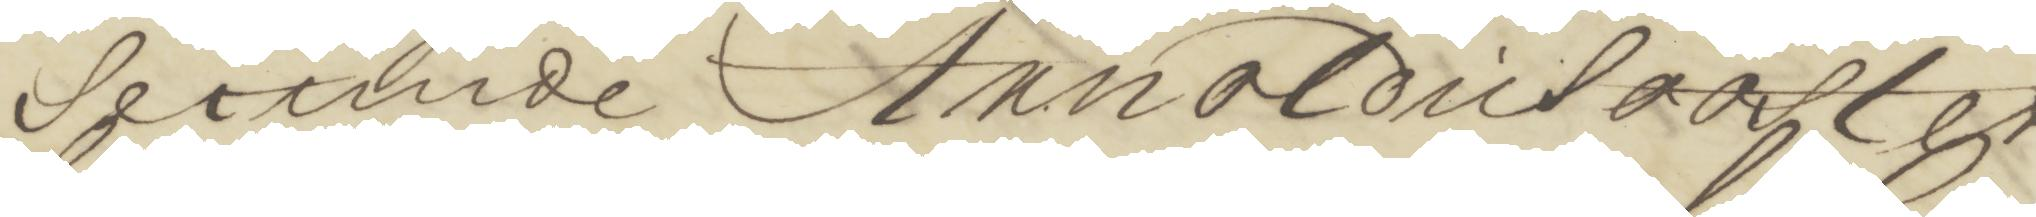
settinde Arnoldus ooster
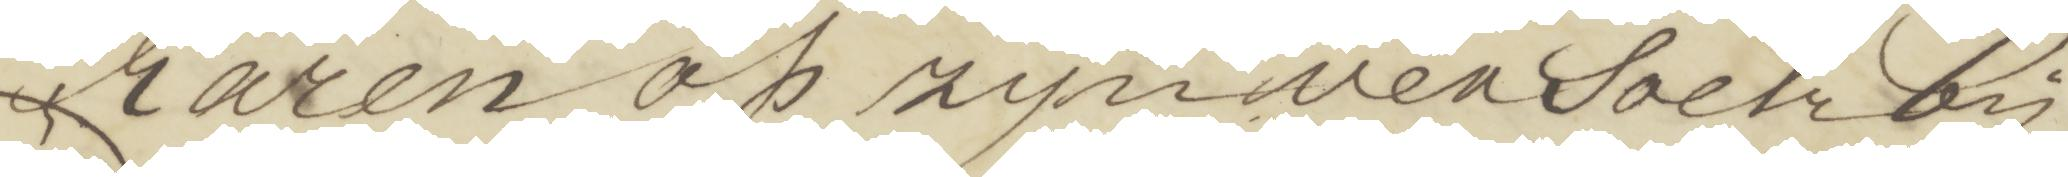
haren op zijn versoek bij
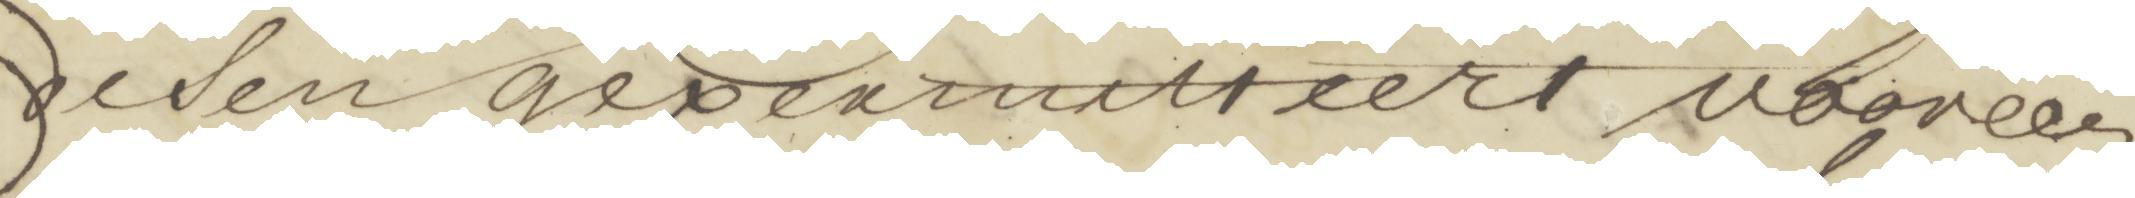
desen gepermitteert voor een
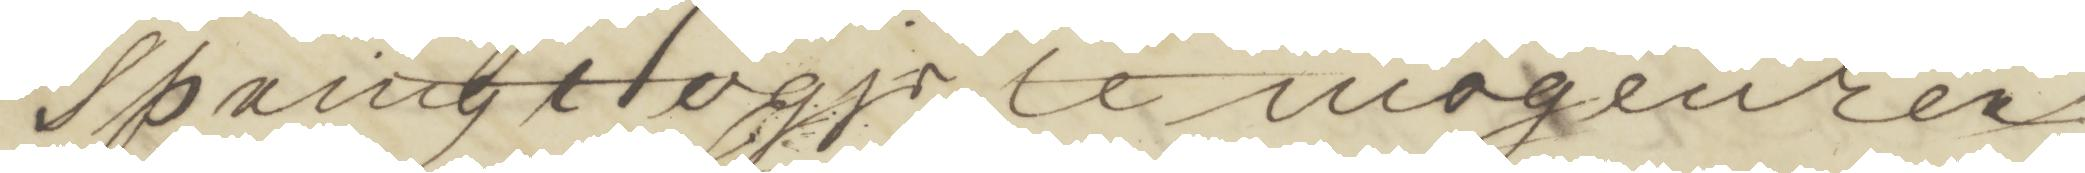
springtogje te mogen her
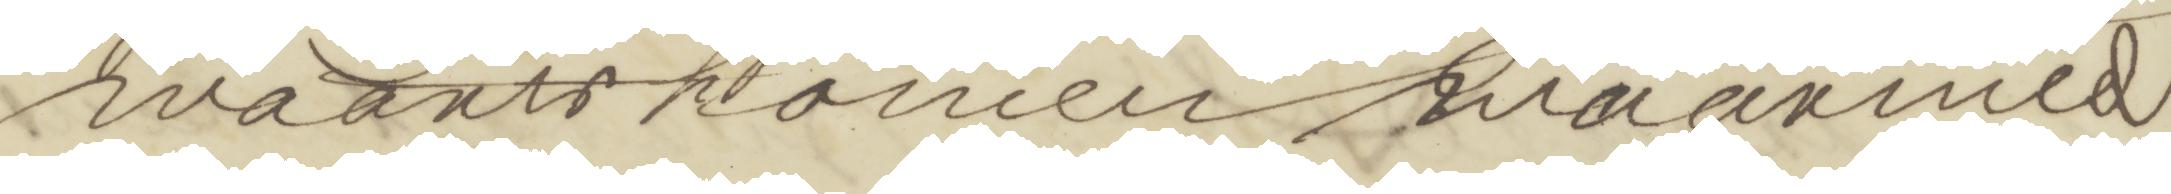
waarts komen waarmede
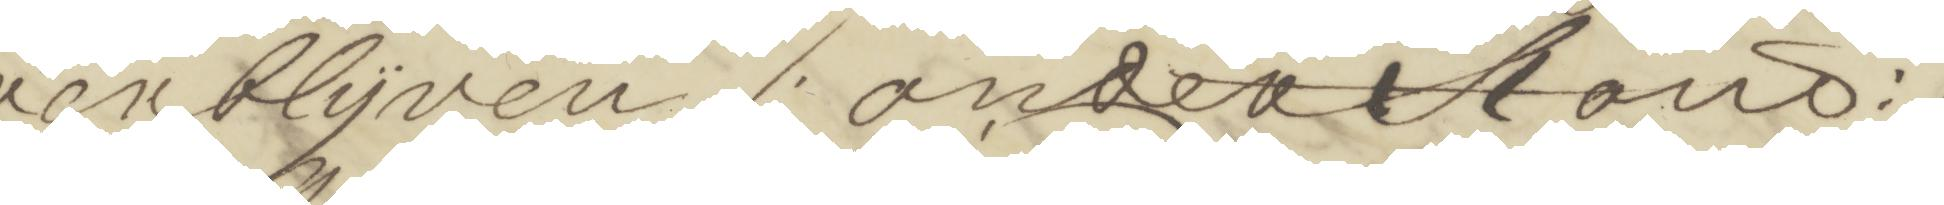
verblijven (:onderstond:)
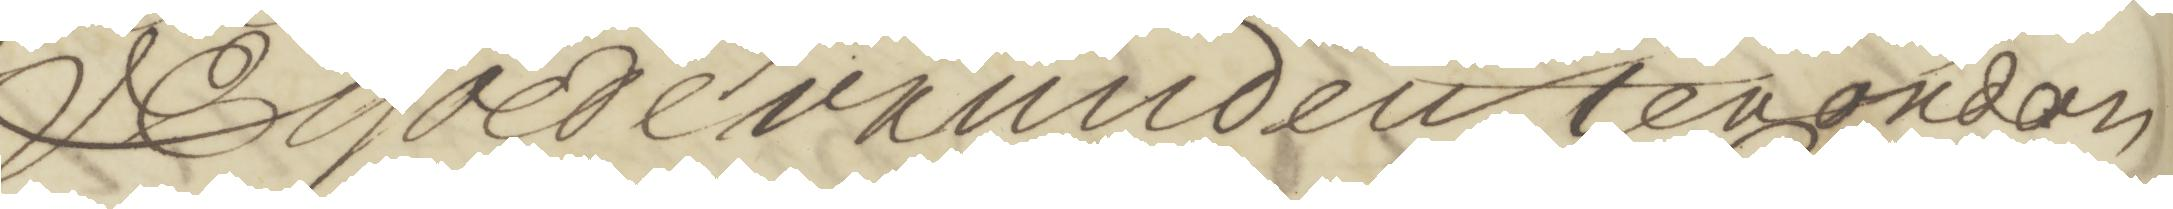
VE goed vrunden ter ordon
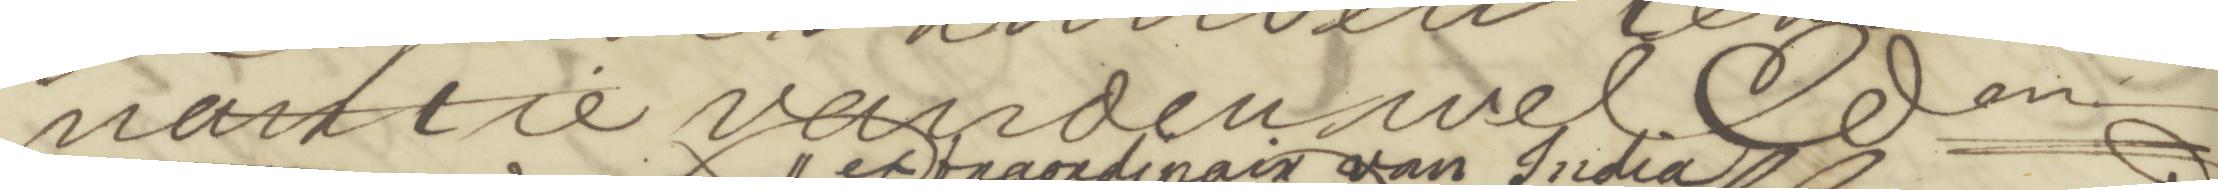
nantie vanden wel Ed=en
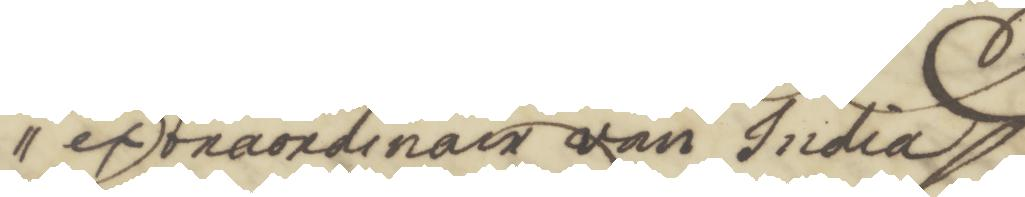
„ extraordinair van India
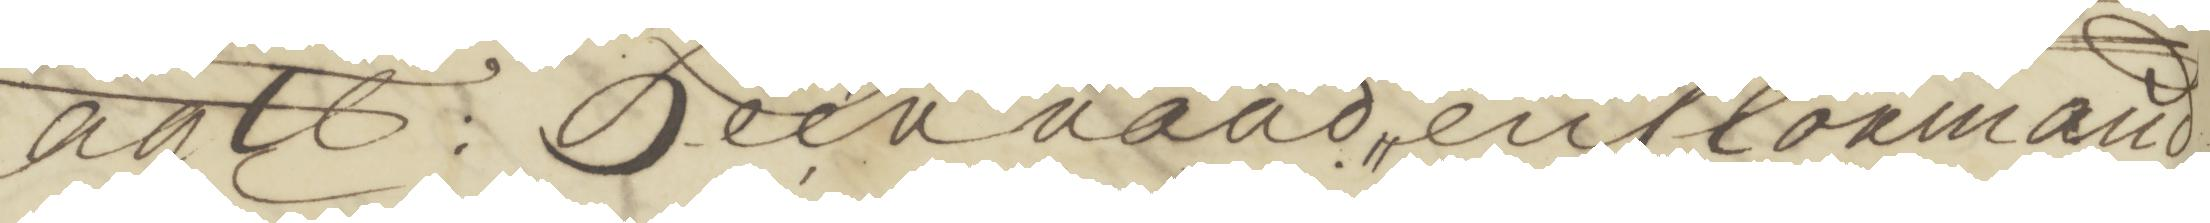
agtb: Heer raad „ en Chormand
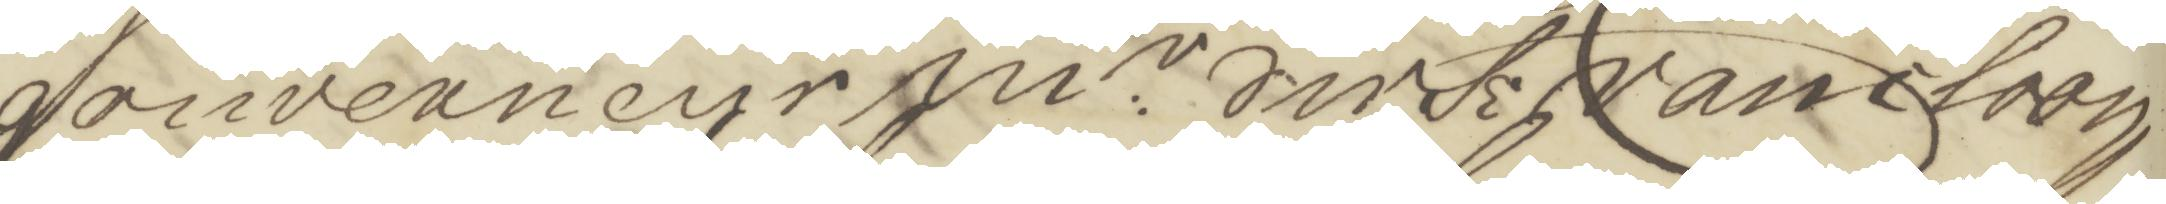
gouverneur m:r dirk van clooy
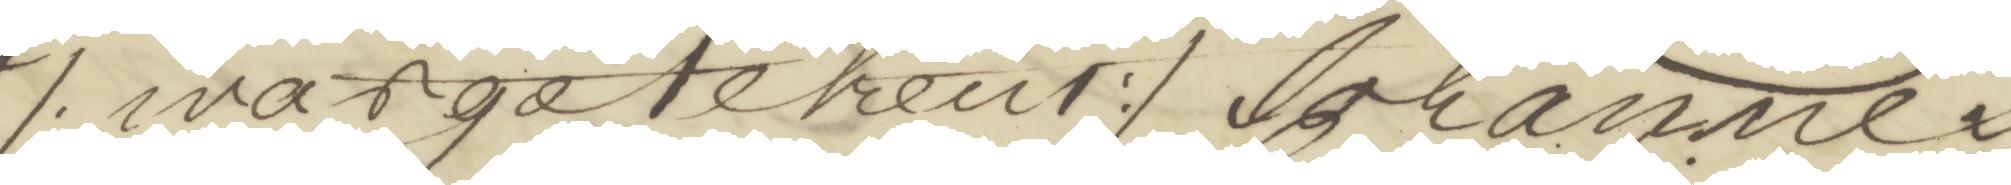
/:was getekent:/ Iohannes
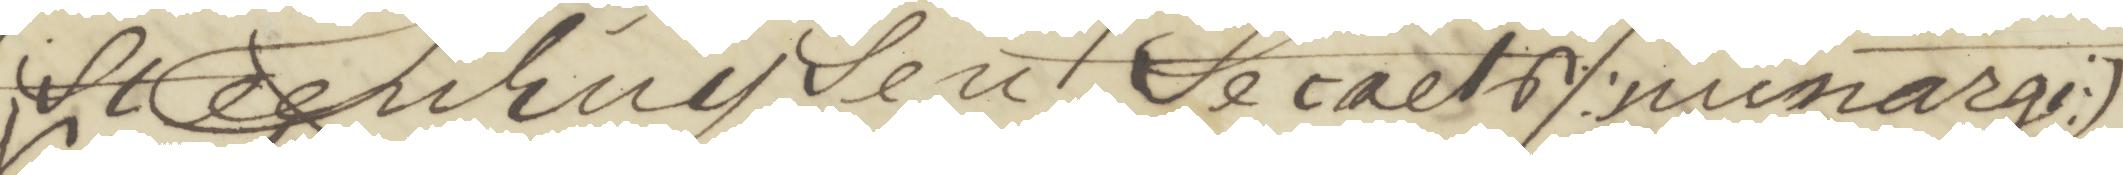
steenhuijsen Secrets /:in margi:)
